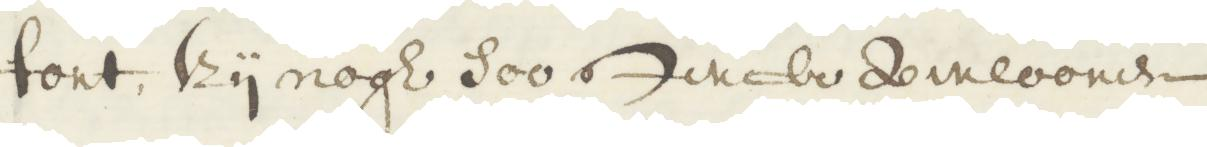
fort, tzij nogh soo sterck verlooren
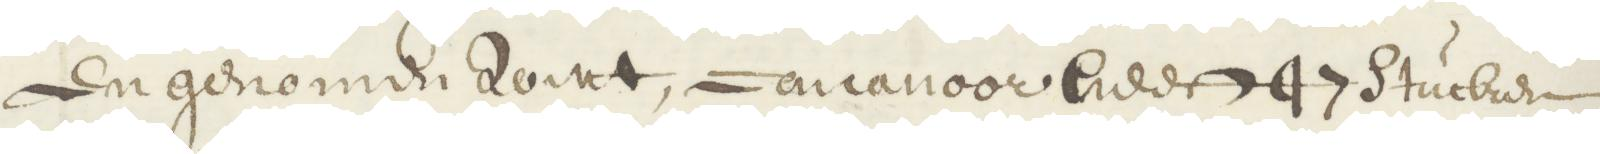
En genomen wert, cananoor heeft 47 stucken
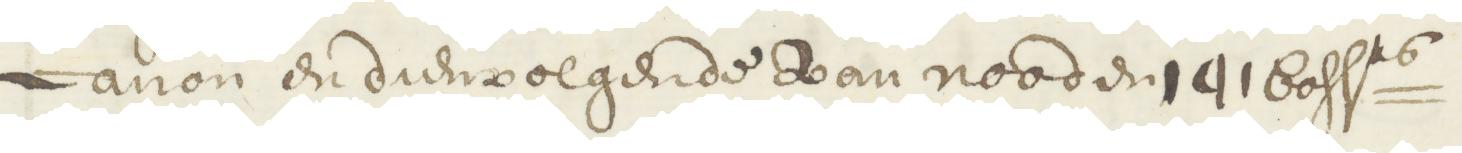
canon en dienvolgende van nooden 141 boss=rs
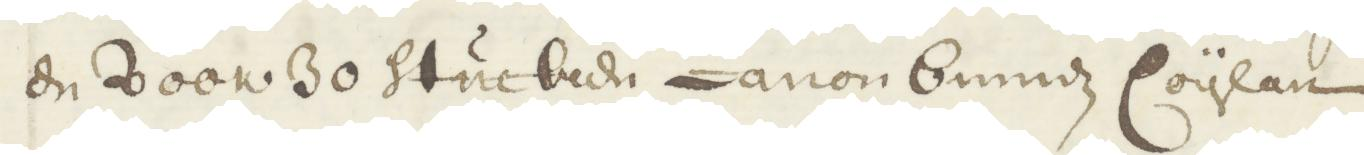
en voor 30 stucken canon binnen Coijlan
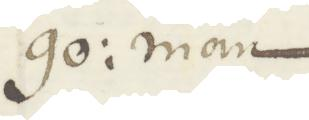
90: man
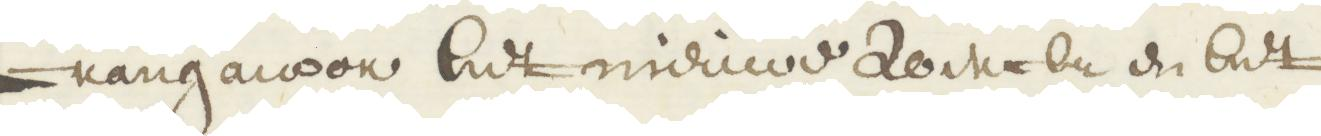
crang awor het nieuwe werck en het
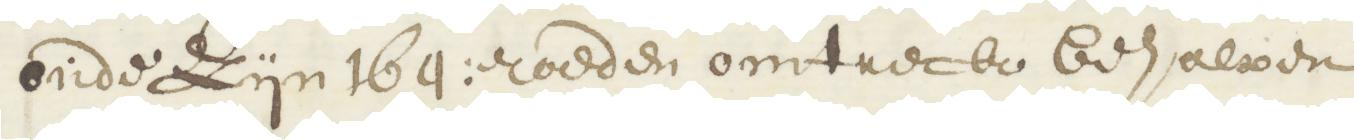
oude zijn 164: roeden omtreck behalven
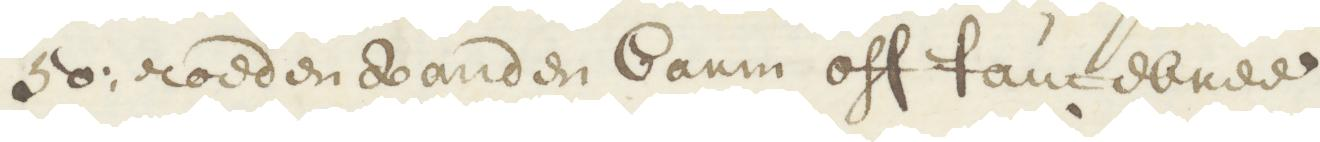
50: roeden vanden barm off faucebree
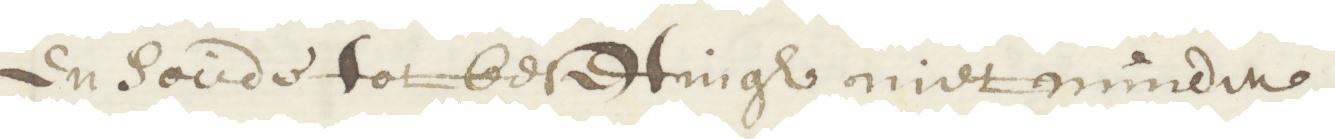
en soude tot besetingh niet minder
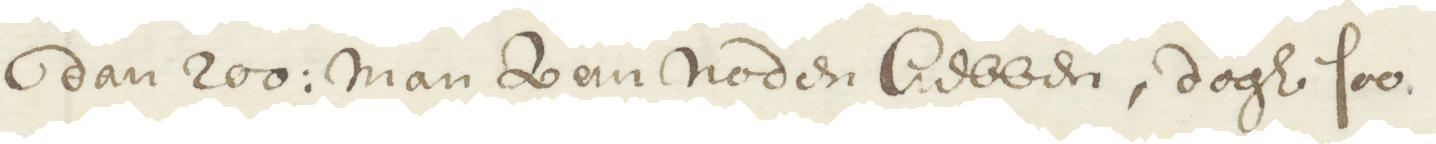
dan 200: man van noden hebben, dogh soo
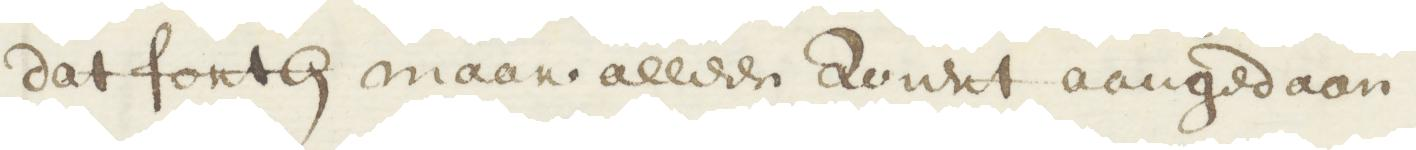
dat forth maar alleen wert aangedaan
